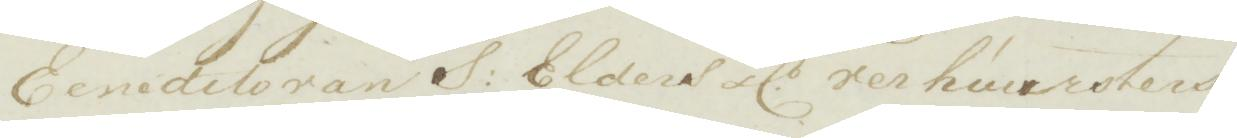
Eene dito van S: Elders & C.o verhuursters
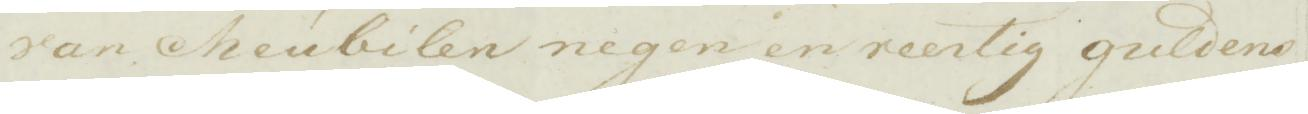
van Meubilen negen en veertig guldens
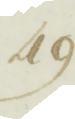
„ 49 25
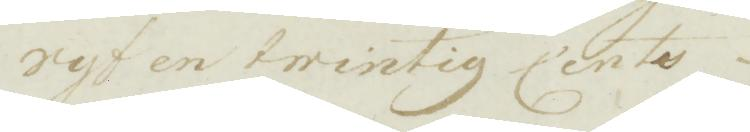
vyf en twintig Cents - - - - - - - - - - - -
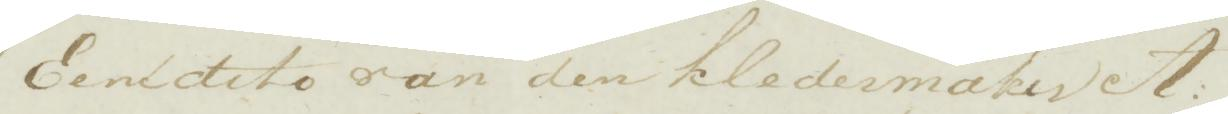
Eene dito van den kledermaker A:
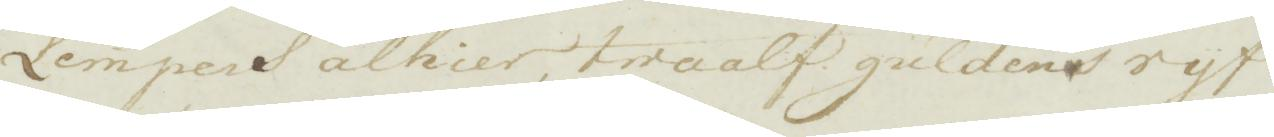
Lempers alhier, twaalf guldens vijf
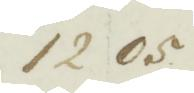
12 05
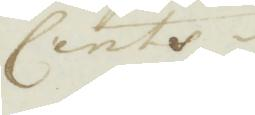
Cents - - - - - - - - - - - - - - - - - - - - - - - - - -
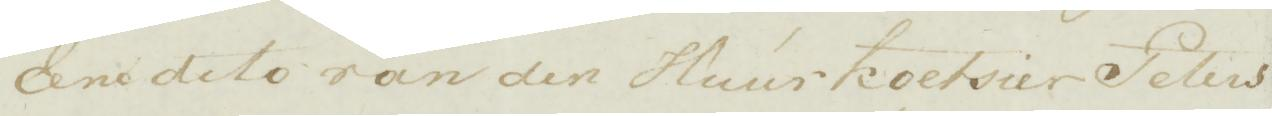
Eene dito van den Huur koetsier Peters
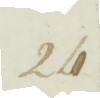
24 —
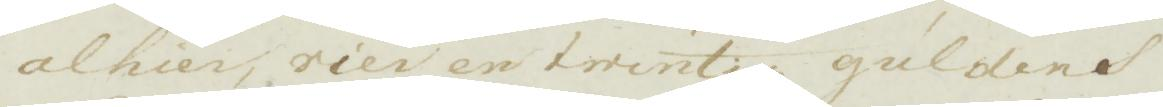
alhier, vier en twintig guldens - - -
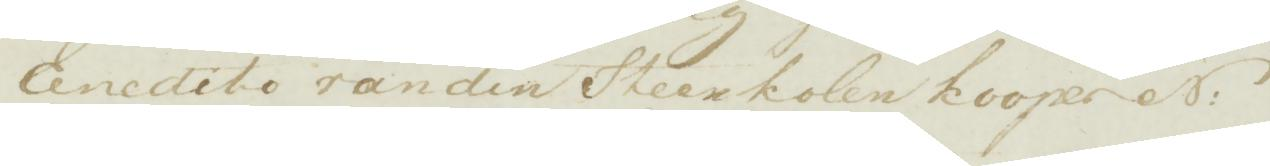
Eene dito van den Heer kolen kooper N:
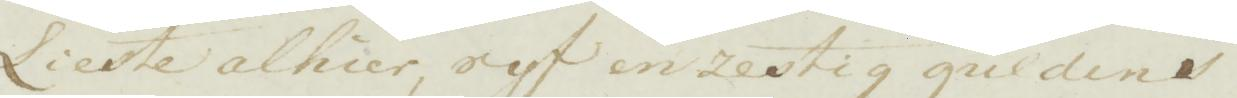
Lieste alhier, vyf en zestig guldens
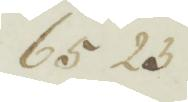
65 23
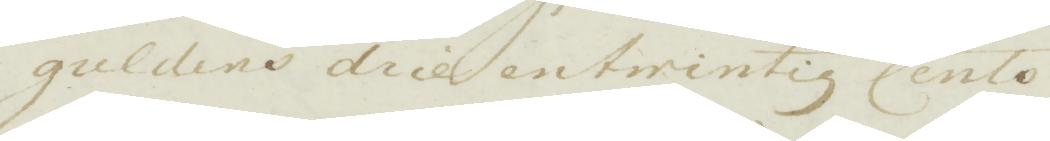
guldens drie en twintig Cents - - - -
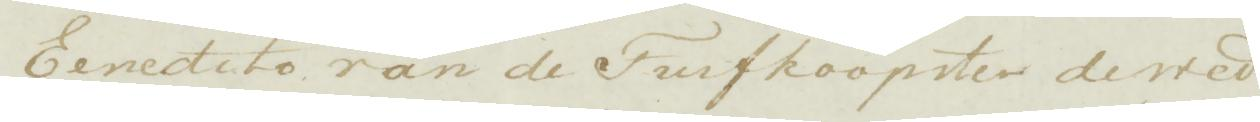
Eene dito van de Turfkoopster de wed
